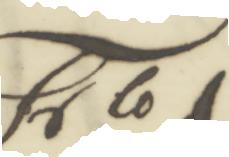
Fo„lo 9
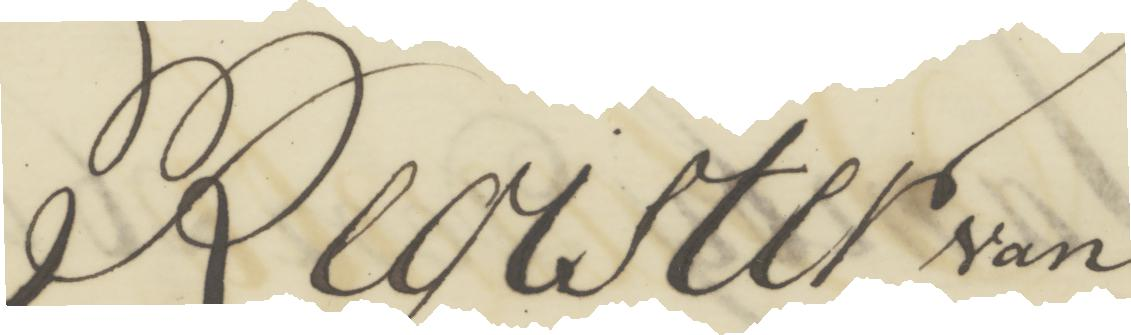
Register van
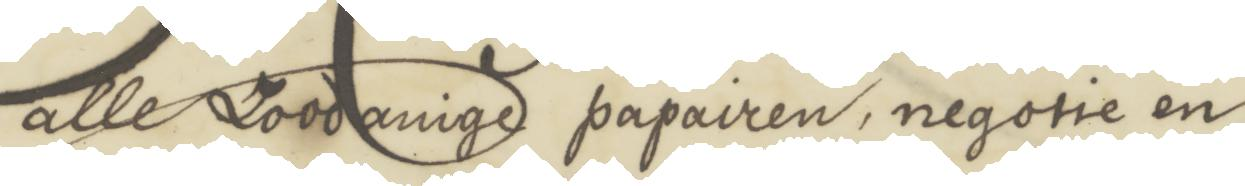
alle zoodanige papairen, negotie en
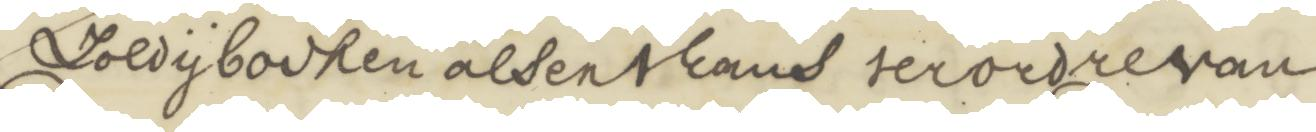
Zoldijboeken alsenthans ter ordre van
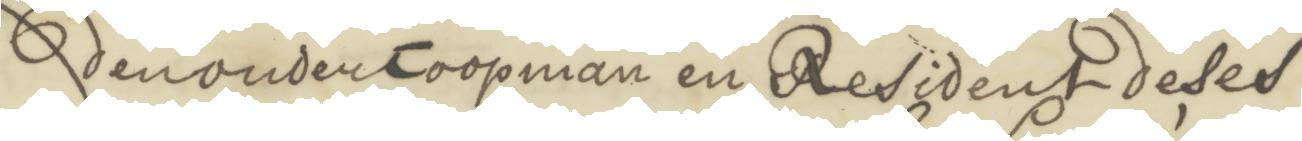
den ondercoopman en Resident deses
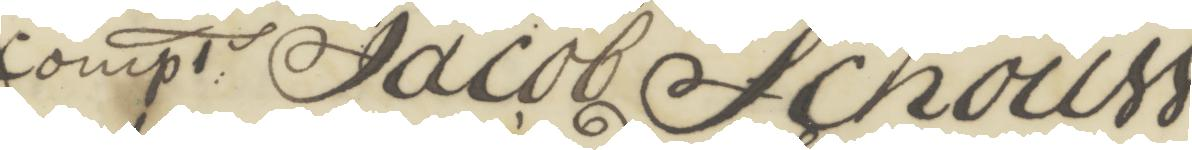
Compt:s Jacob Schouw
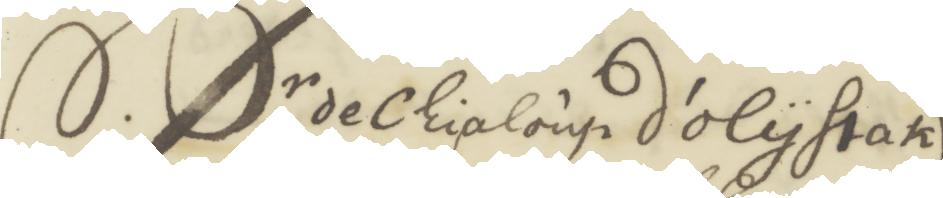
P„r de Chialoup d’olijftak
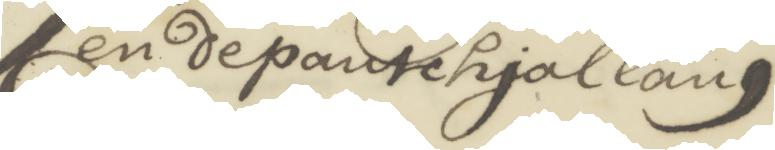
en depantchjallang
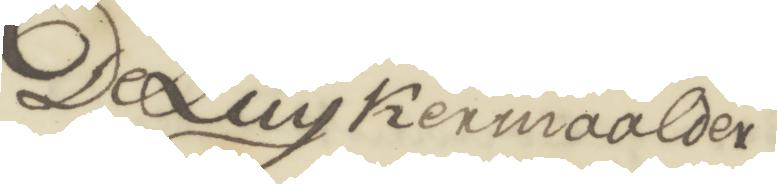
De Zuijkermaalder
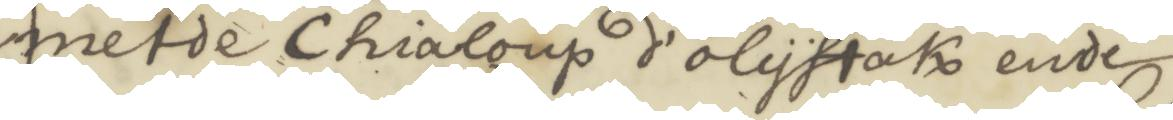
met de Chialoup d’ olijftak ende
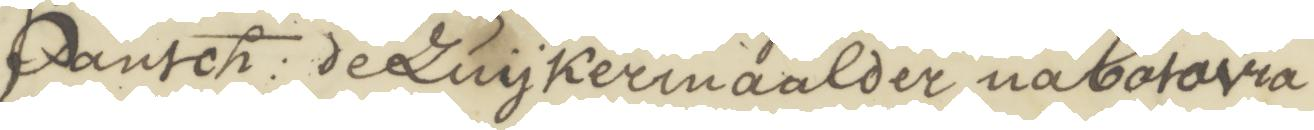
Pantch: de Zuijkermaalder na batavia
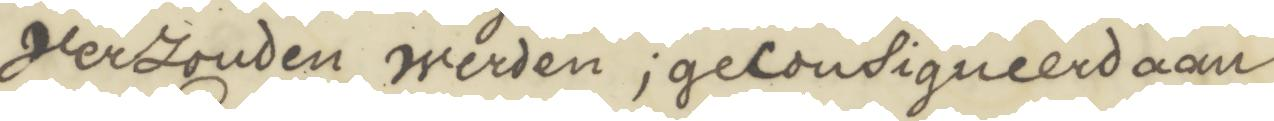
verzonden werden; geconsigneerd aan
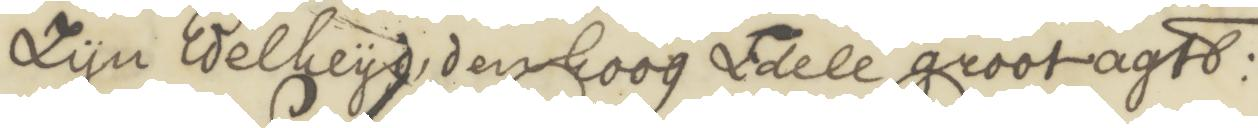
zijn Edelheijd, den Hoog Edele groot agtb:
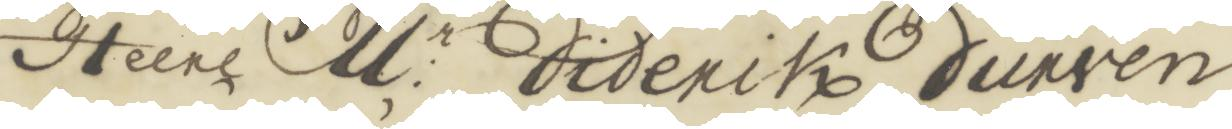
Heere M:r Diderik Durven,
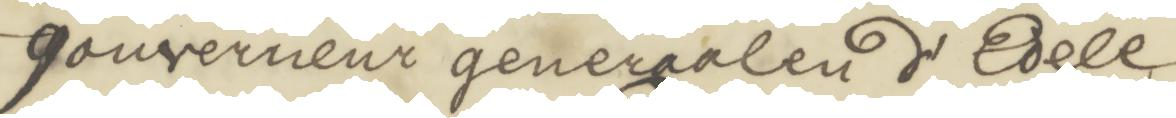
gouverneur generaalen d’ Edele
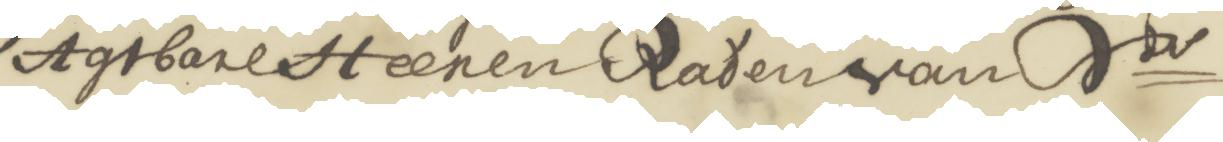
Agtbare Heeren Raden van d=to
